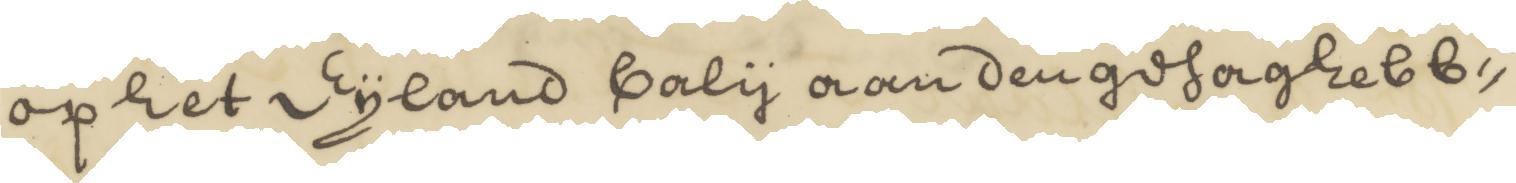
op het Eijland balij aan den gesaghebb„
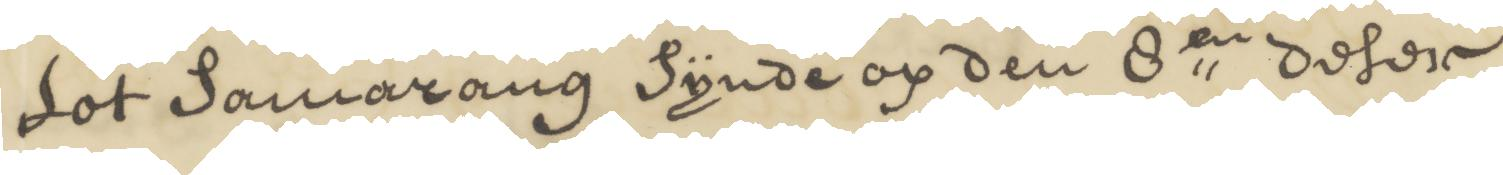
tot samarang sijnde op den 8:en deser
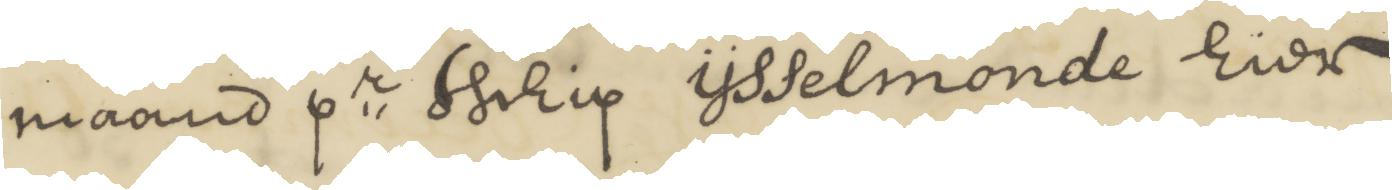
maand p„r 'tschip ijsselmonde hier
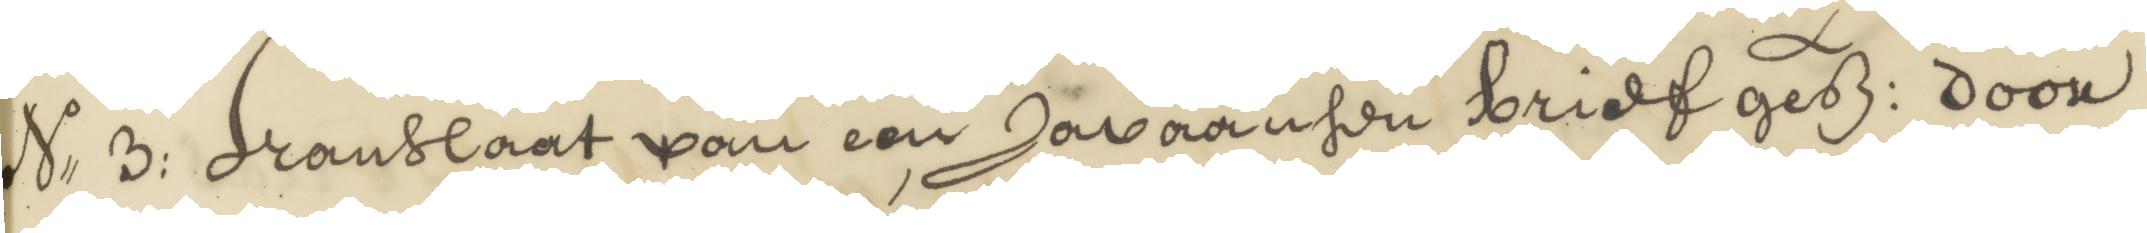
N„3: translaat van een Javaansen brief ges: door
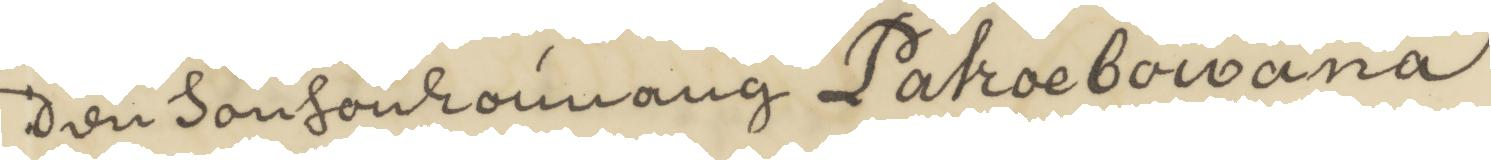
den sousouhounang Pakoebowana
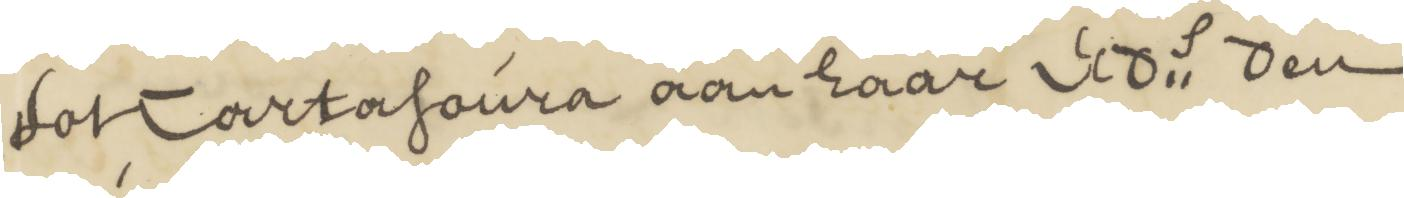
tot Cartasoura aan haar Ed:e den
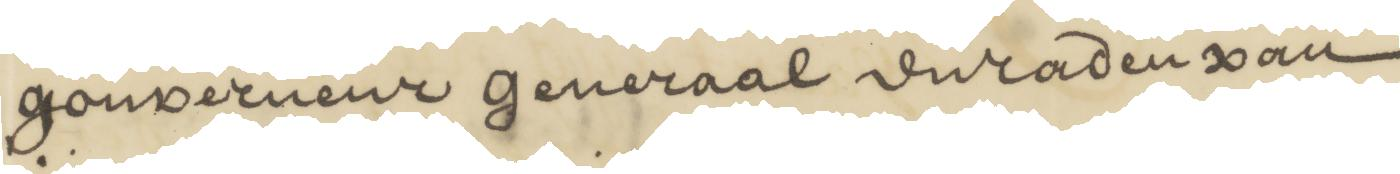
gouverneur generaal en raden van
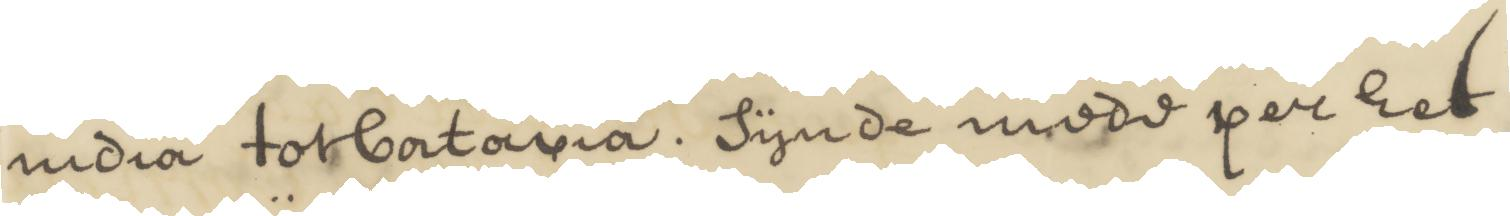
india totbatavia. sijnde mede per het
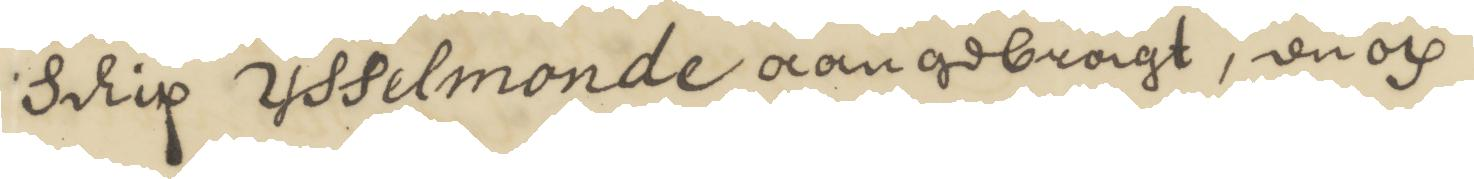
schip ijsselmonde aangebragt, en op
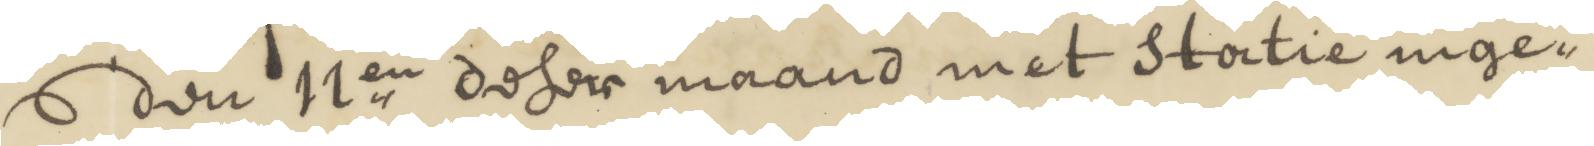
den 11„en deser maand met statie inge„
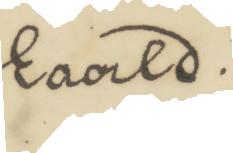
haald.
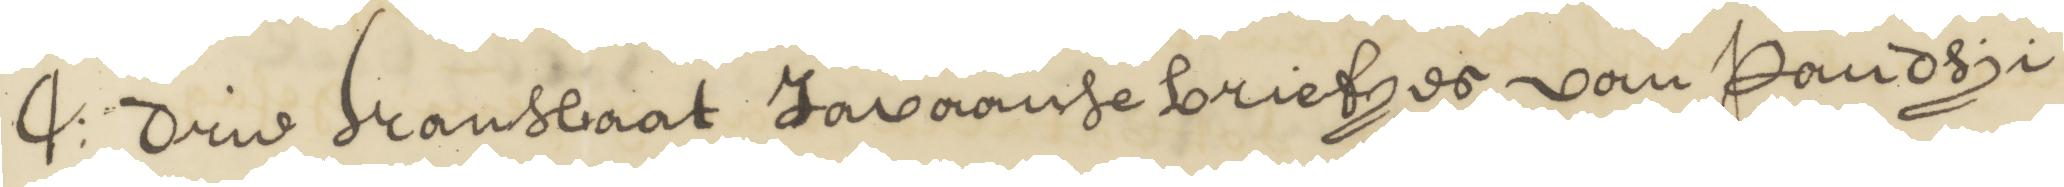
4: drie translaat Javaanse briefjes van pandsji
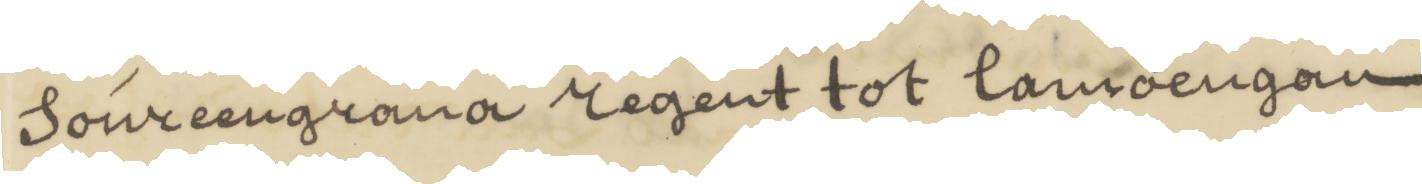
Soureengrana regent tot lamoengan
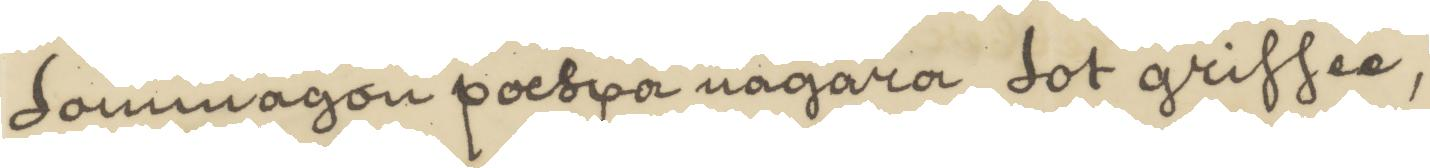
tommagon poespa nagara tot griffie,
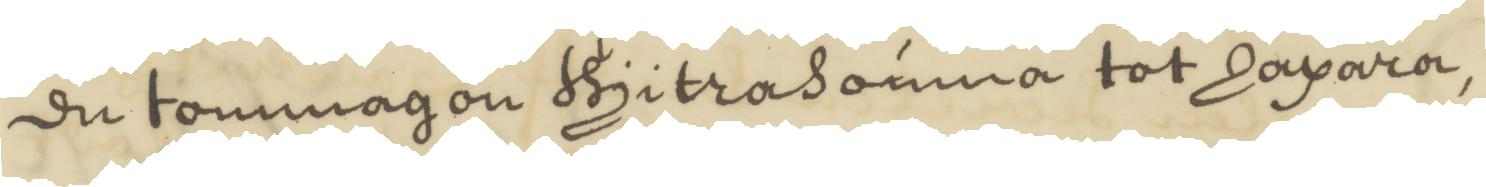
en tommagon tsjitrasouma tot Japara,
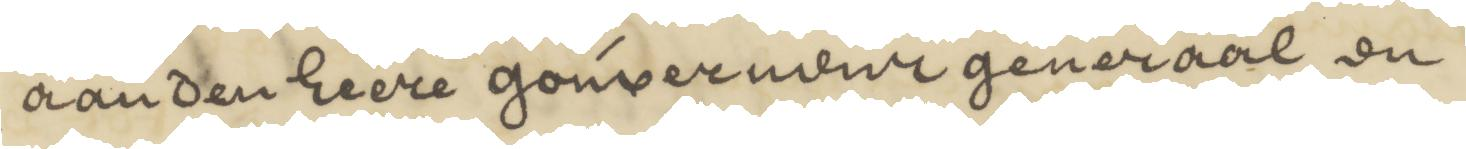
aan den heere gouverneur generaal en
